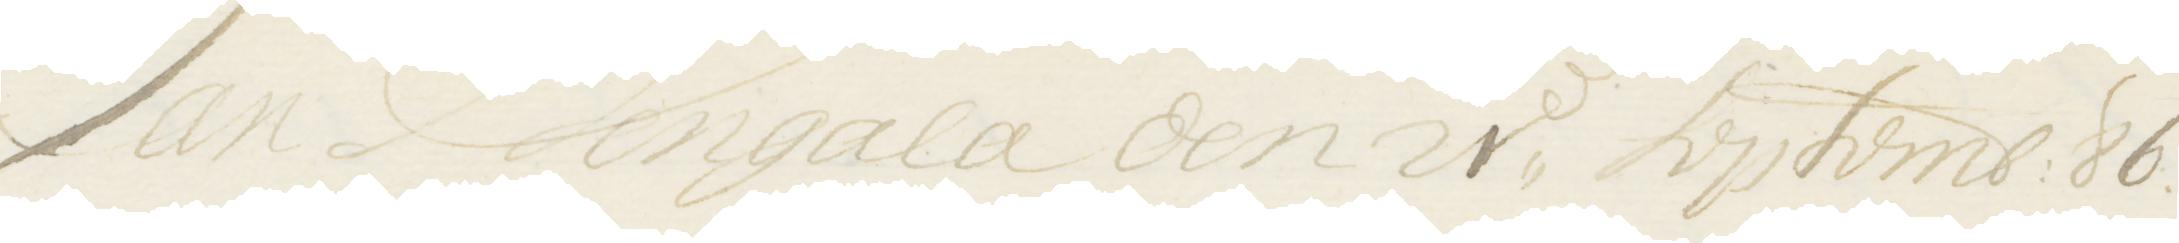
Van Bengala den 21„e Septemb: 86
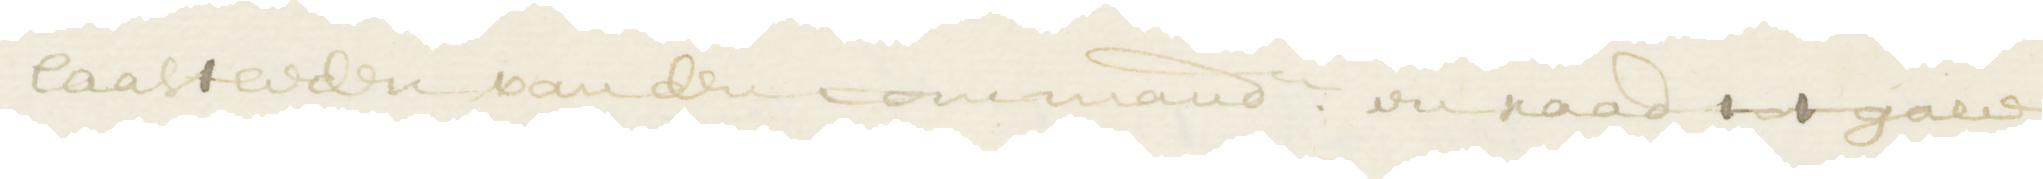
laastleden van den command:r en raad tot gale
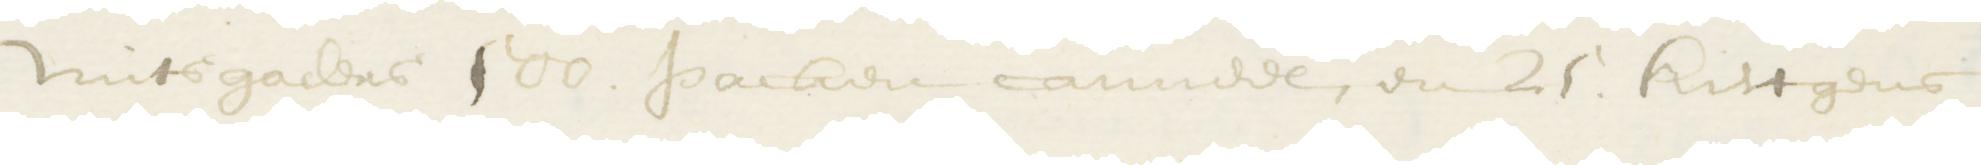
mitsgaders 500. packen canneel, en 25. kistgens
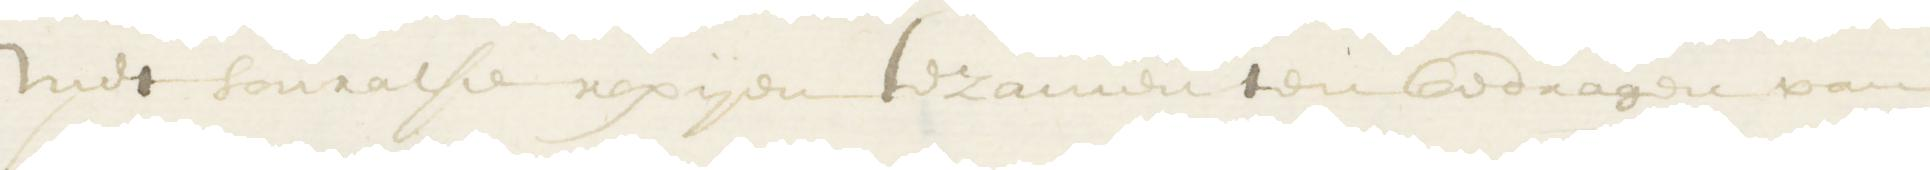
met souratse ropijen tezamen ten bedragen van
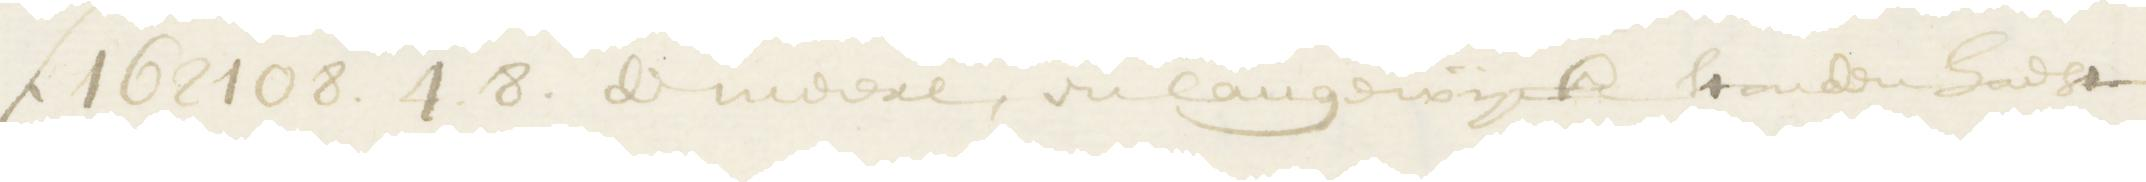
ƒ 162108. 1. 8. de meere, en langewijck stonden haeft
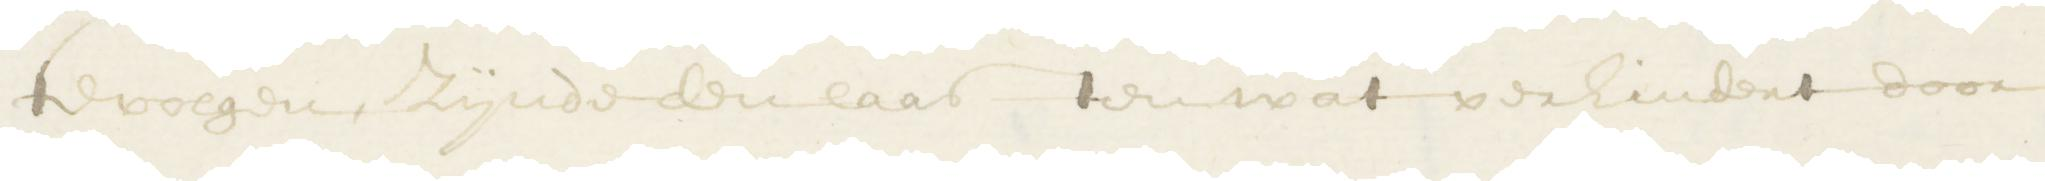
tevolgen, zijnde den laasten wat verhindert door
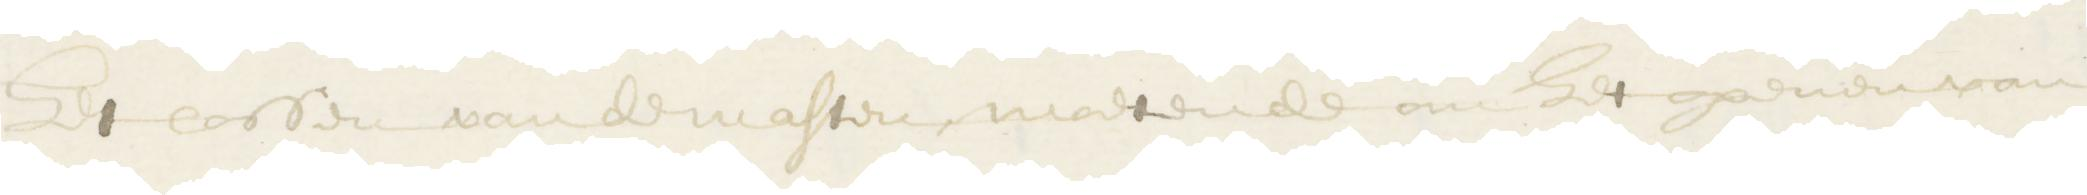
het costen van de masten, moetende om het openen van
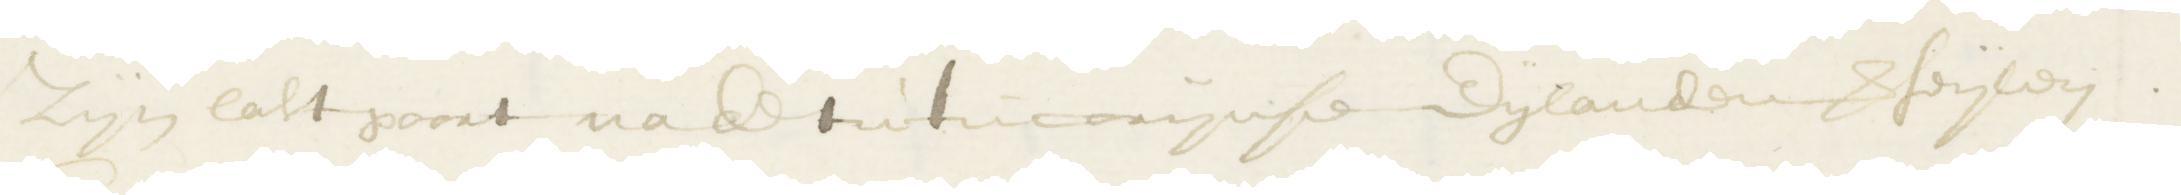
zijn last poort na de tutucorijnse Eijlanden verseijlen.
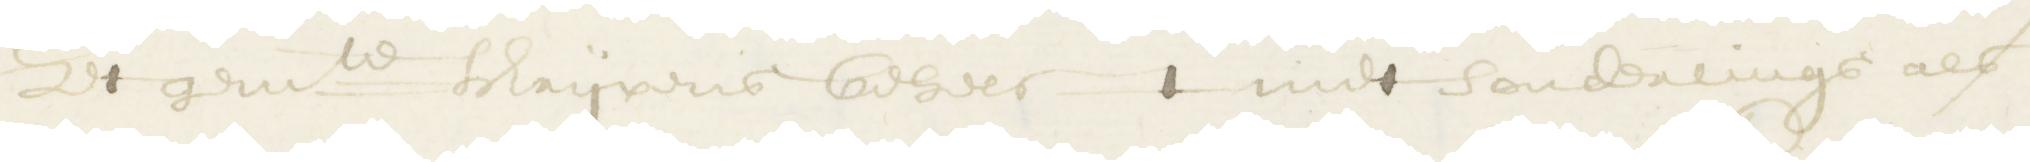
Het gem=te schrijvens behelst niet sonderlings als
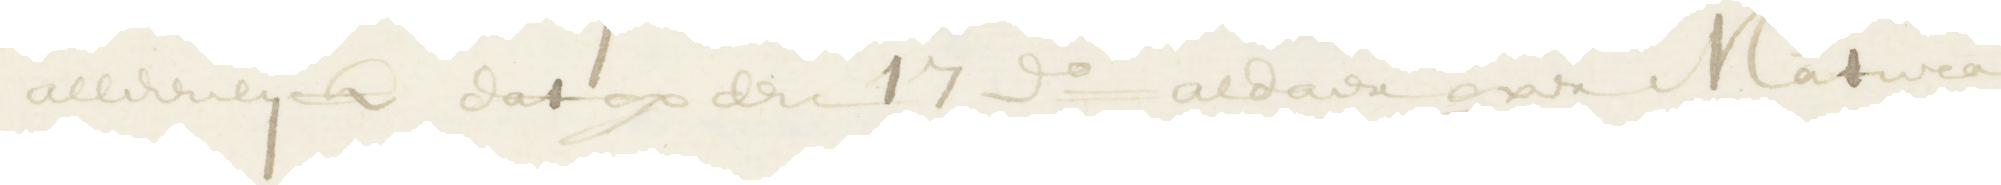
alleenlijck dat op den 17 d=o aldaer over Matura
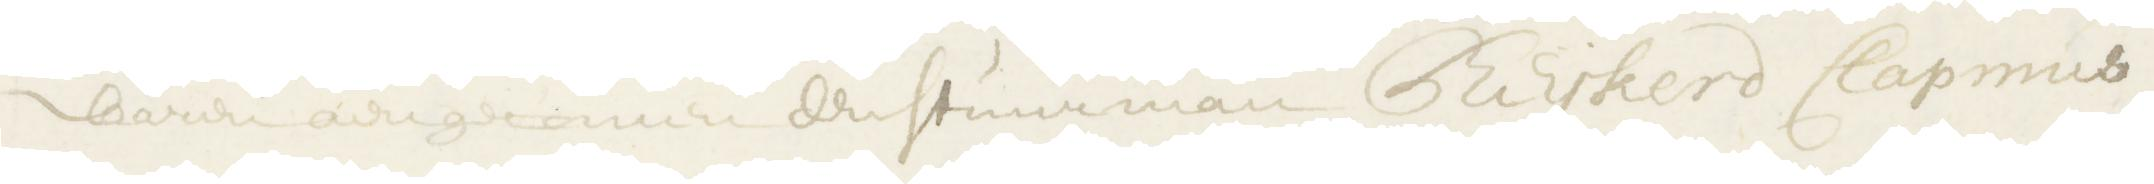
waren aengecomen den stuurman Reijkerd Clapmus
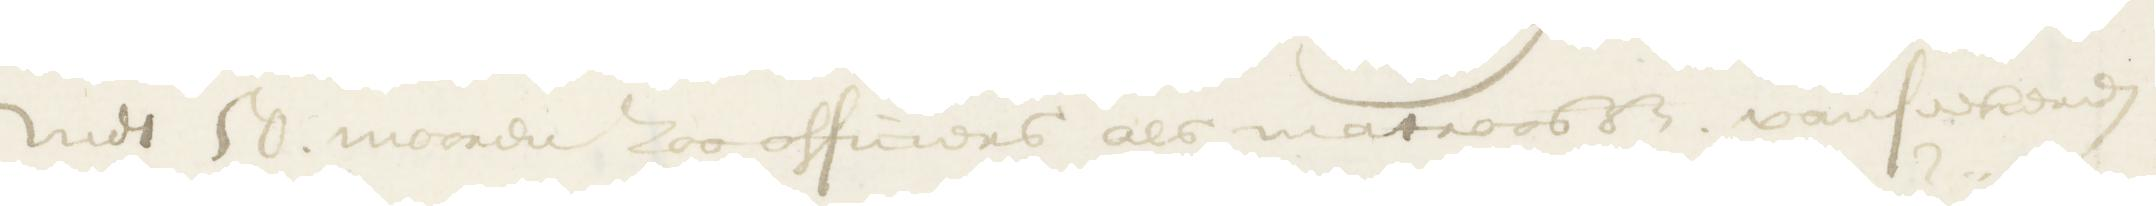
met 50. mooren zoo officiers als matroostz. van seekeren
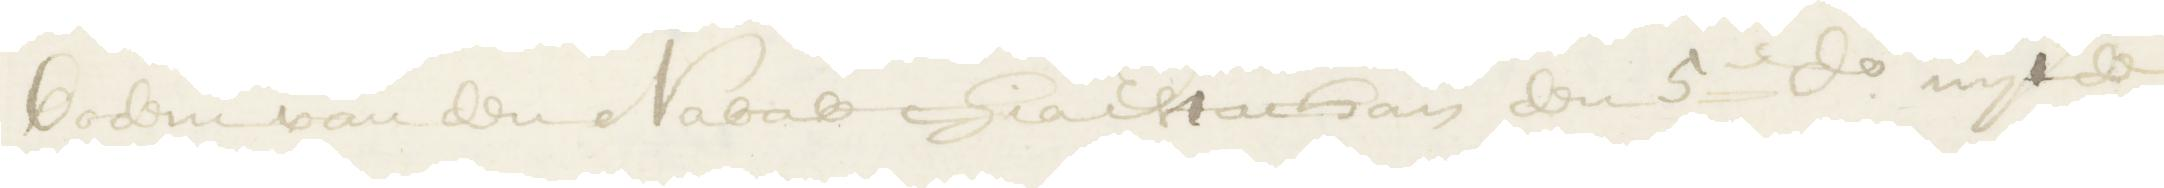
bodem van den Nabab chiaestackan den 5=en d.o uijt de
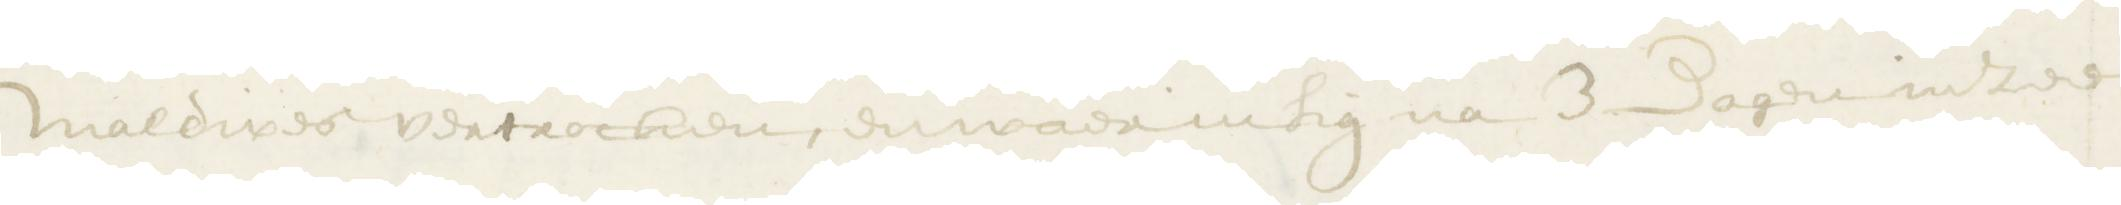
maldives vertrocken, en waer in sig na 3 Dagen in zee
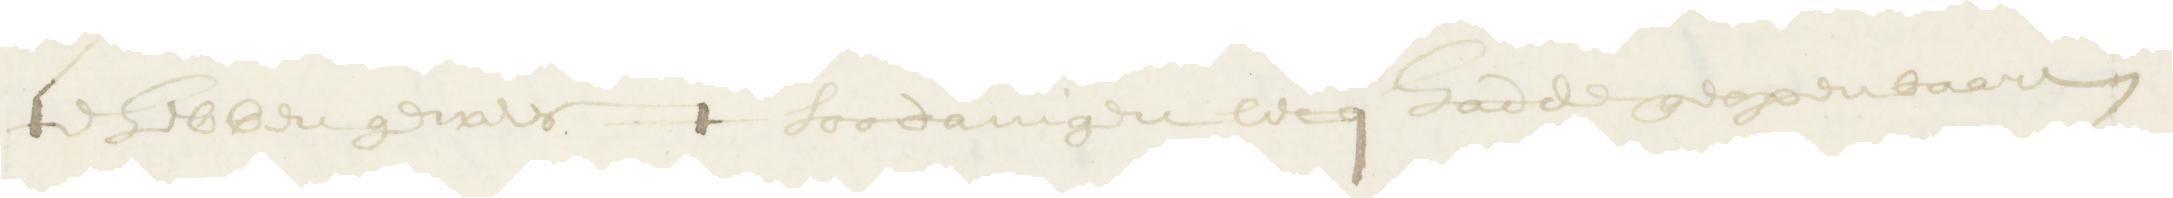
te hebben geweest soodanigen lecq hadde geopenbaart
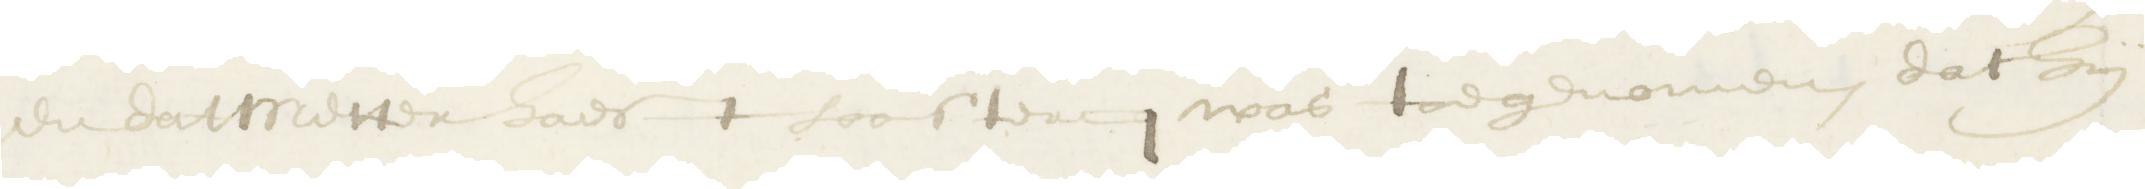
en dat metter haest soo stercq was toegenomen, dat hij
